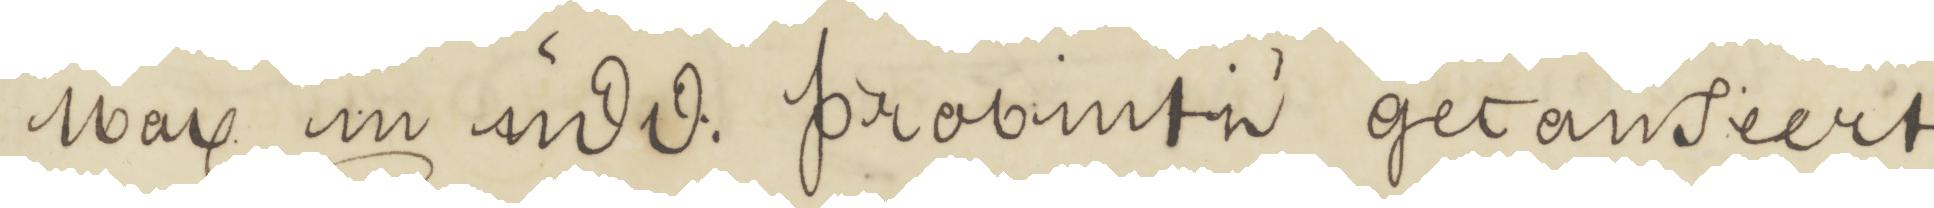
wax in uEE: provintie gecauseert
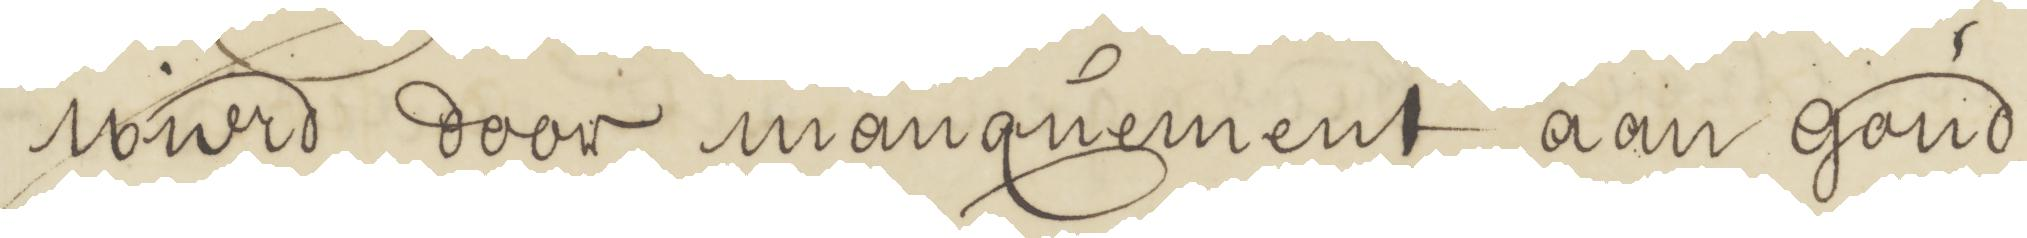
wierd door manquement aan goud
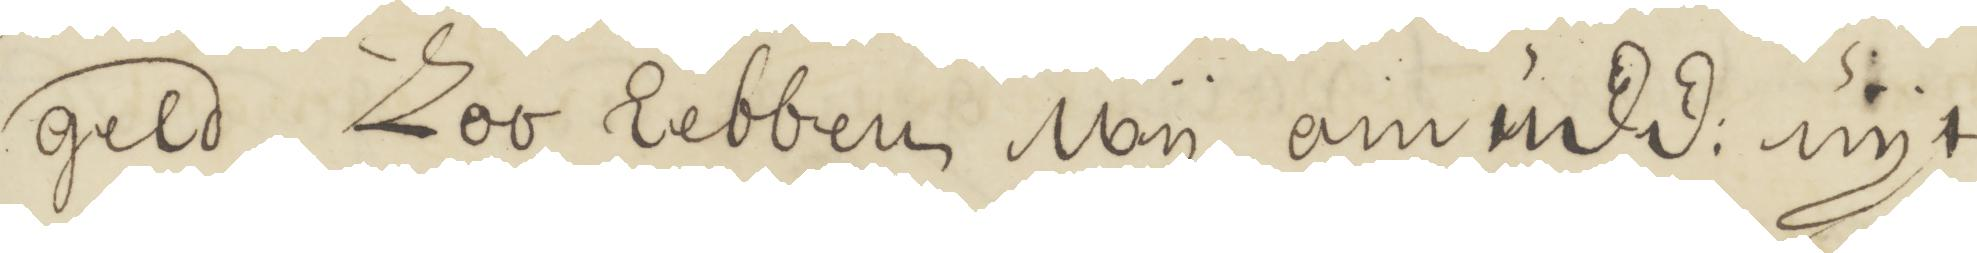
geld, Zoo hebben wij om uEE: uijt
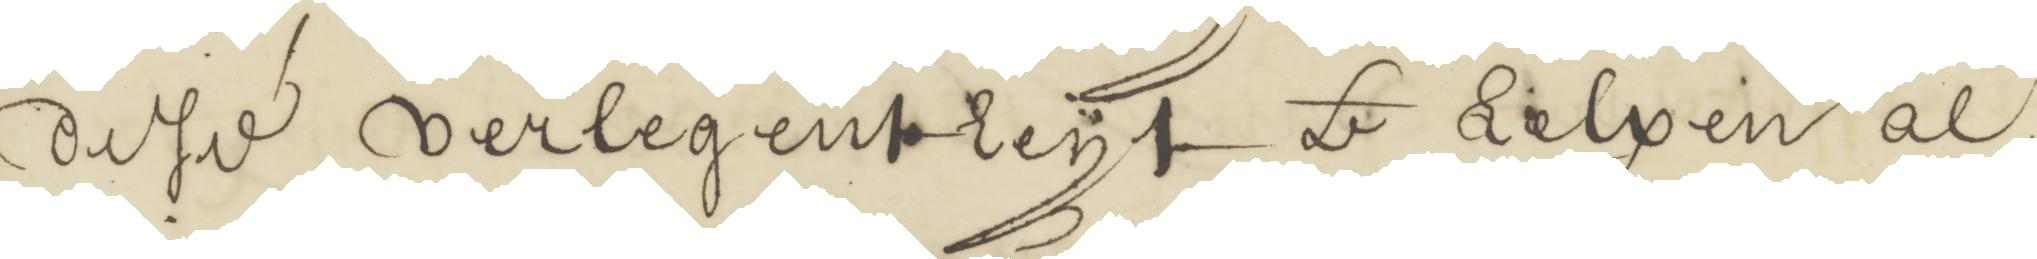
dese verlegentheijt te helpen al„
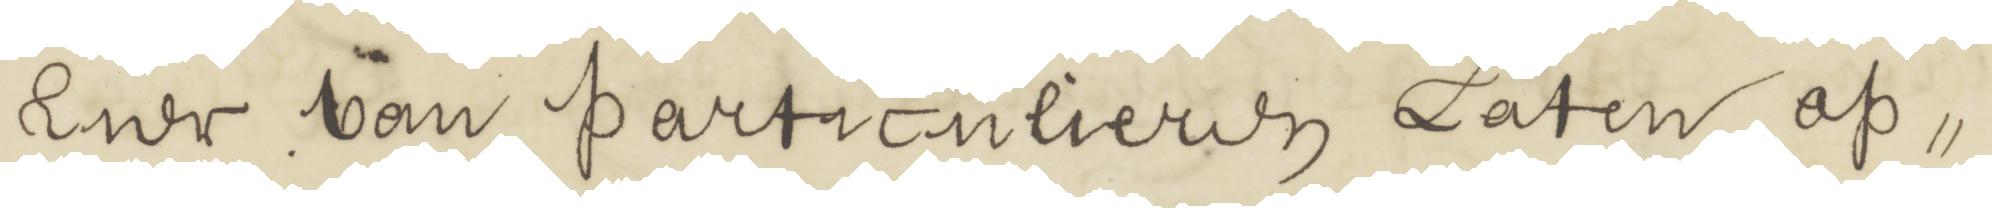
hier van particulieren Laten op„
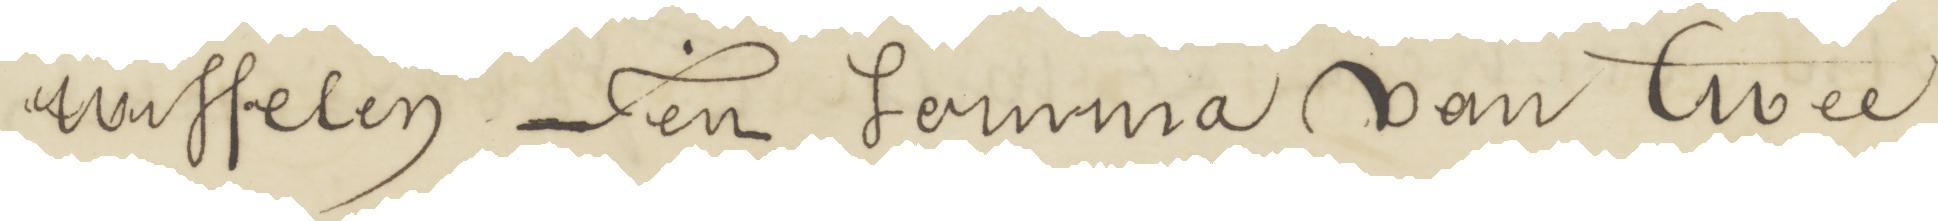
wisselen Een somma van twee
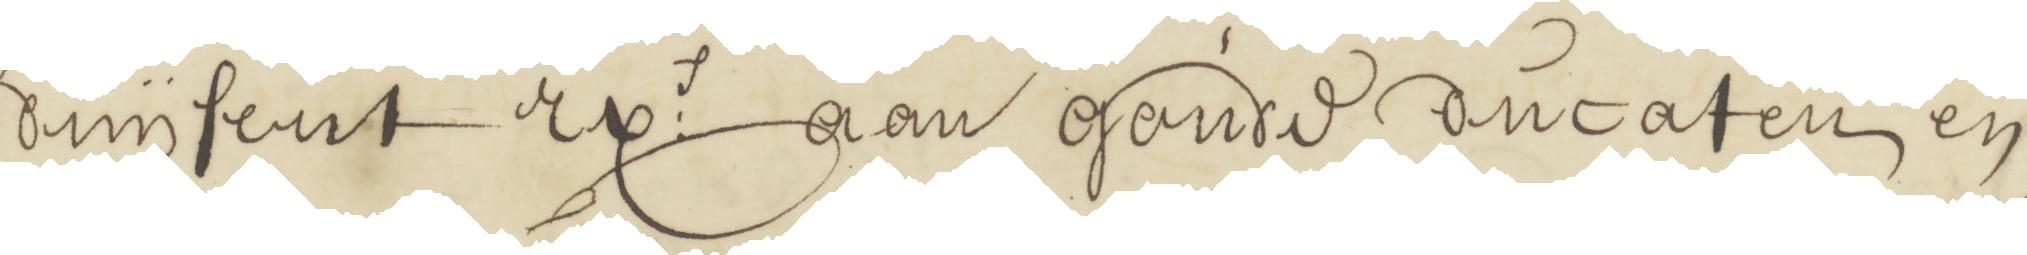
duijsent rx:s aan goude ducaten en
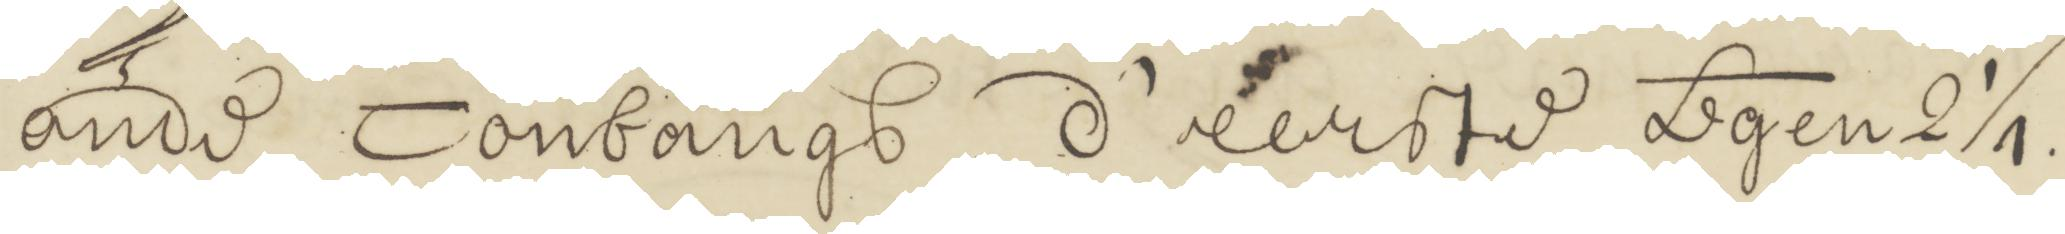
oude Coubangs d’ eerste tegen 2 ¼.
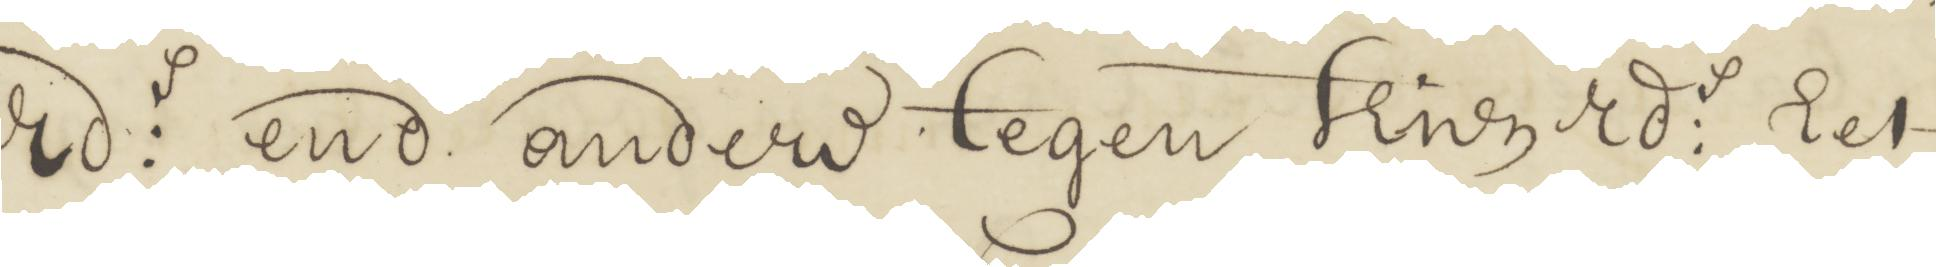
rd:s end' andere tegen thien rd:s het
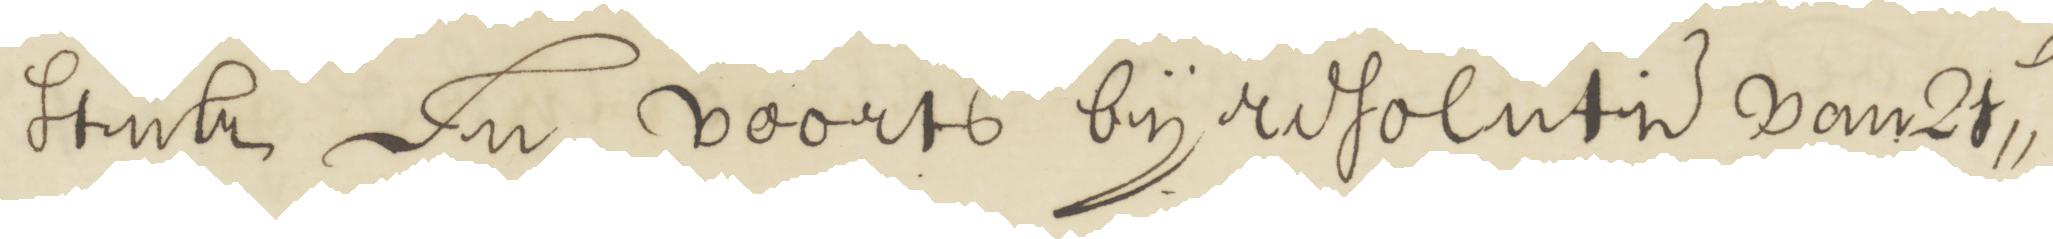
stuk En voorts bij resolutie van 21„'
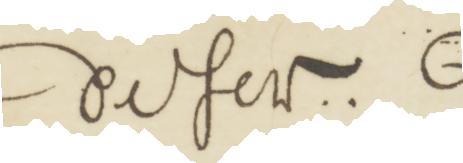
deser..
